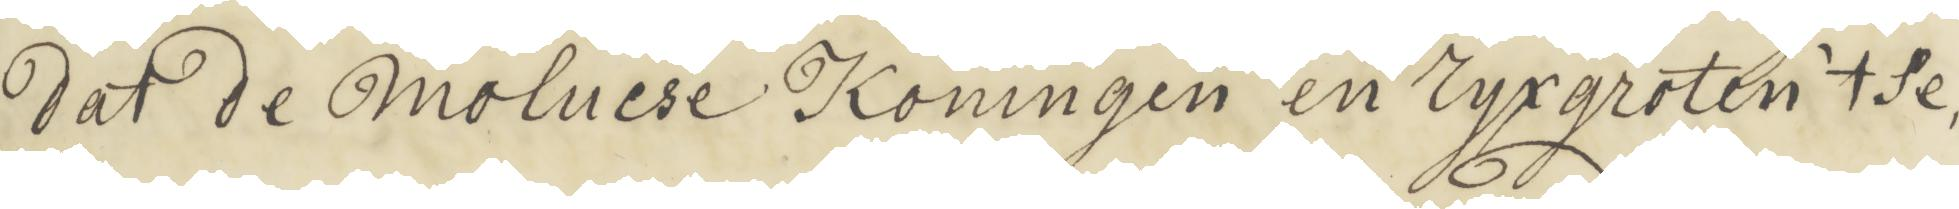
dat de molucse Koningen en ryxgroten ’t se„
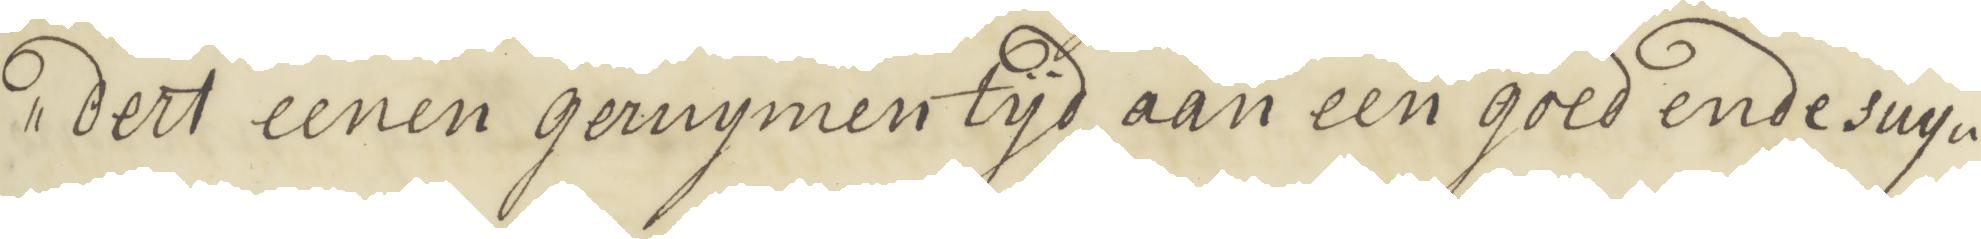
„dert eenen geruymen tijd aan een goed ende suy
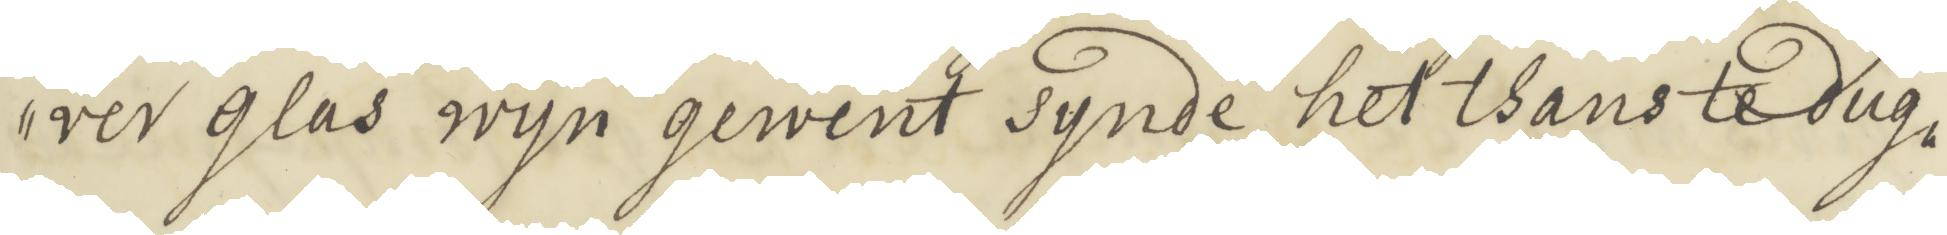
„ver glas wyn gewent synde het thans te dug„
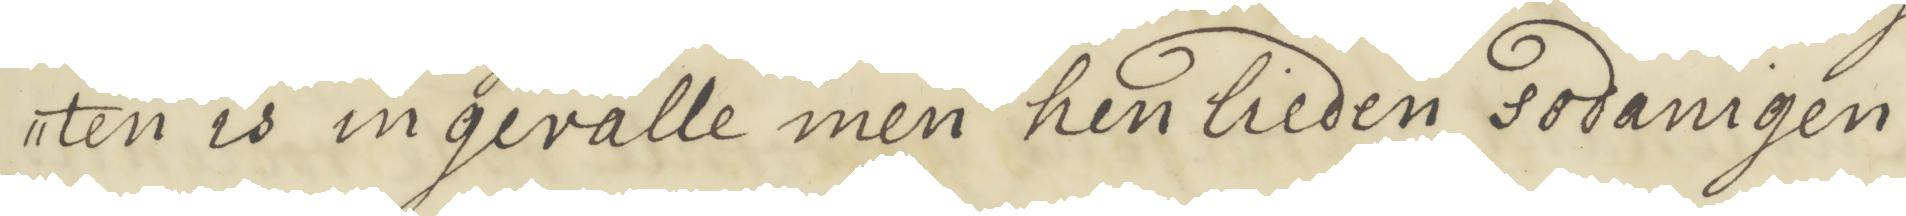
„ten is in gevalle men hen lieden sodanigen
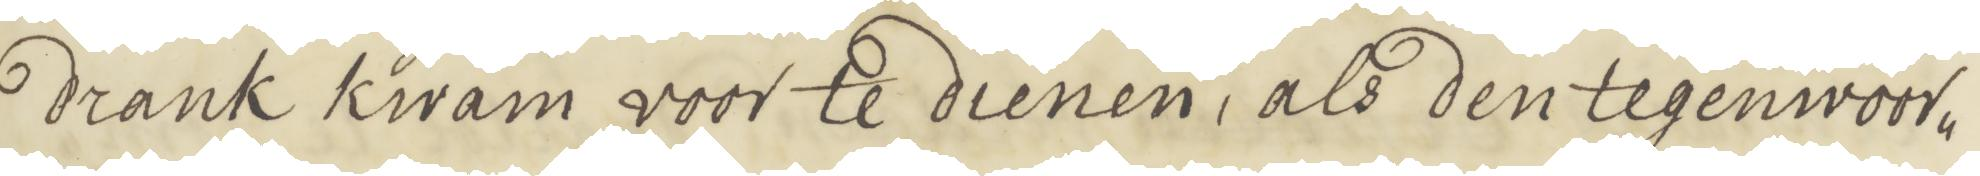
drank kwam voor te dienen, als den tegenwoor„
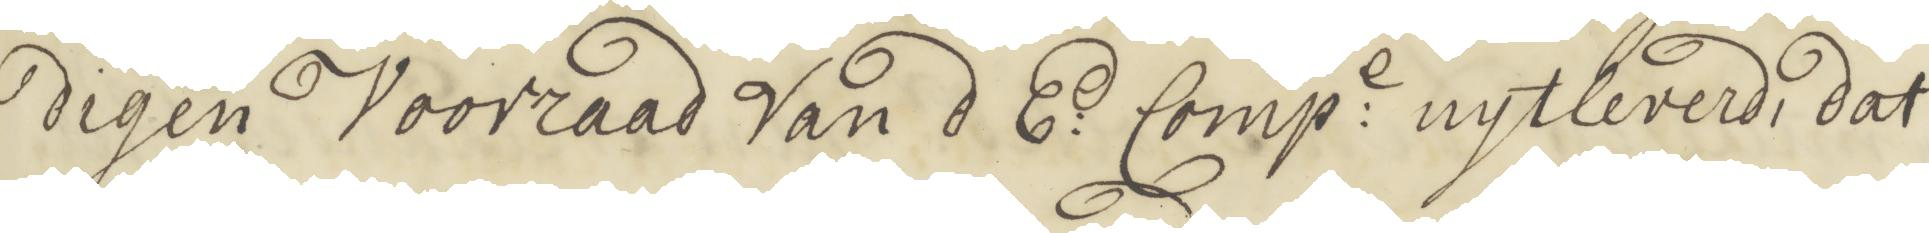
digen Voorraad van d E: Comp:e uijtleverd, dat
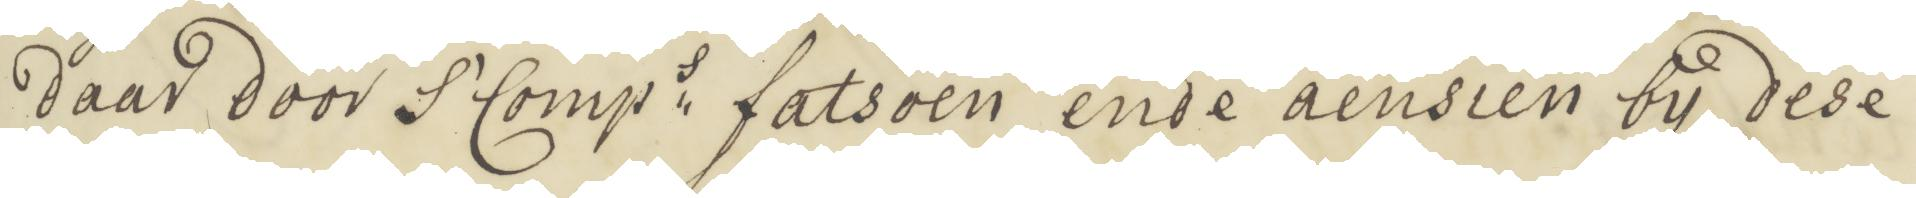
daar door s' Comp„s fatsoen ende aensien by dese
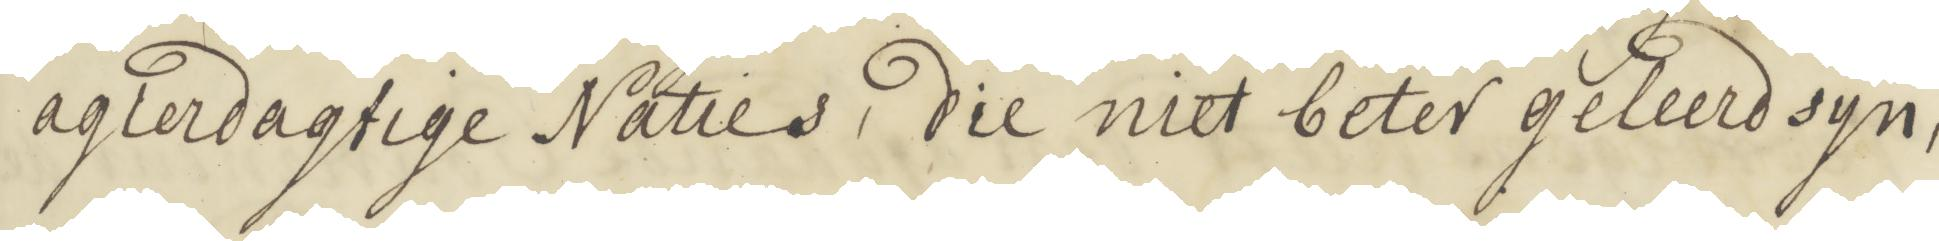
agterdagtige Naties, die niet beter geleerd sijn
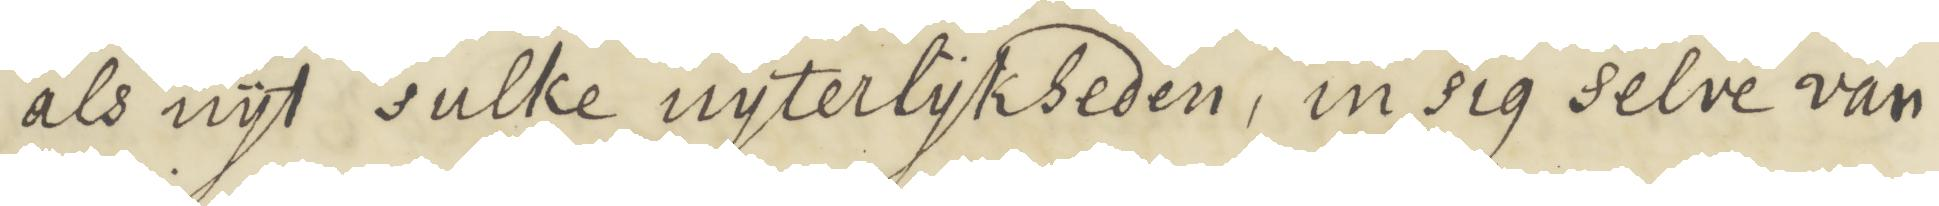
als uijt sulke uijterlijkheden, in sig selve van
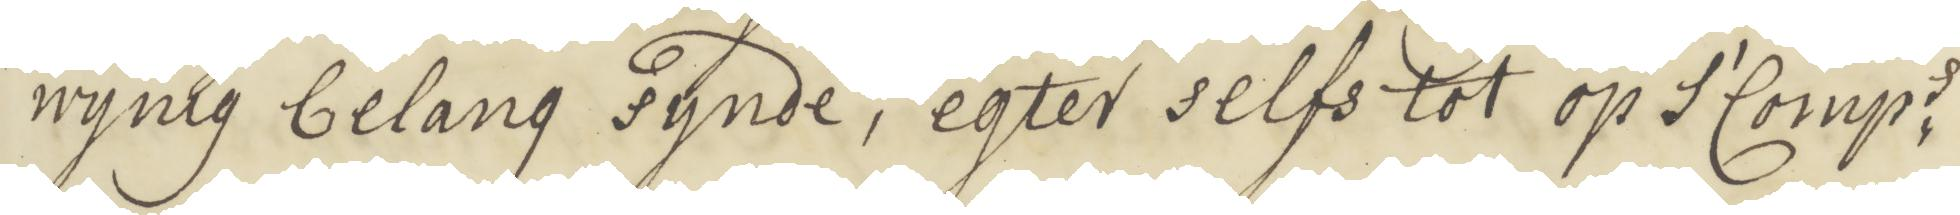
wynig belang synde, egter selfs tot op s'Comp„s
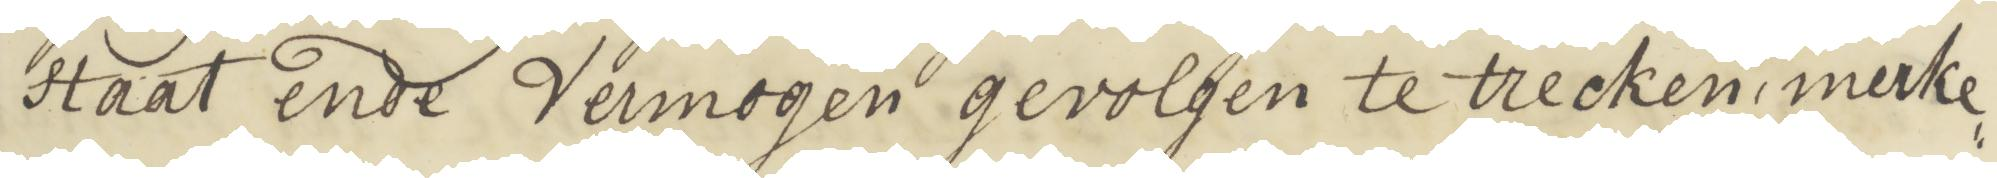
staat ende vermogen gevolgen te trecken, merke„
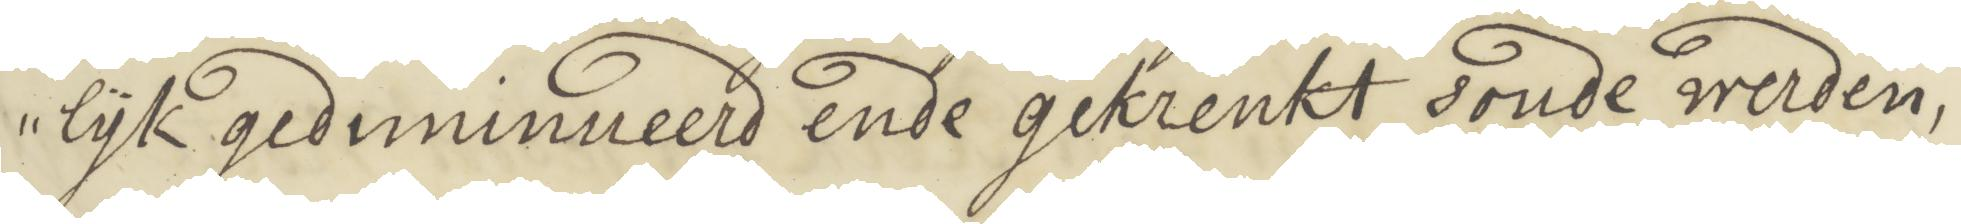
„lijk gediminueerd ende gekrenkt soude werden,
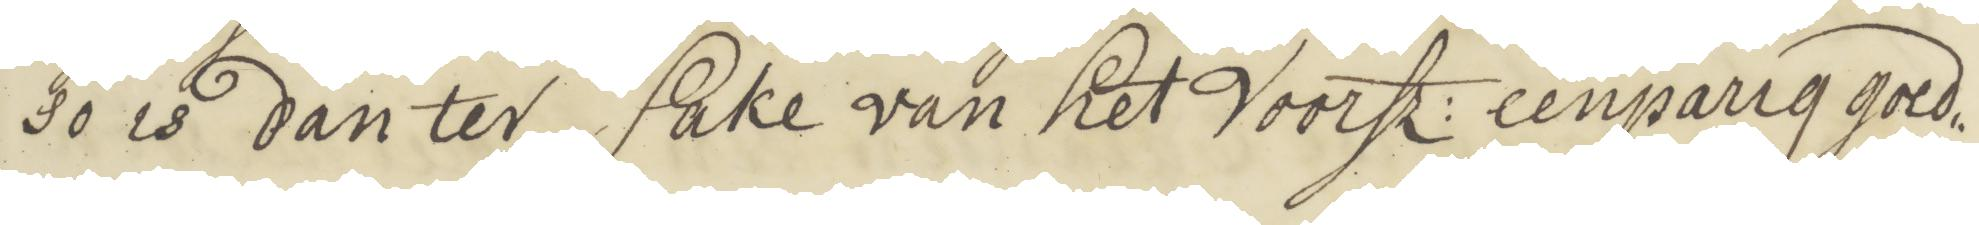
so is dan ter sake van het voorsz: eenparig goed„
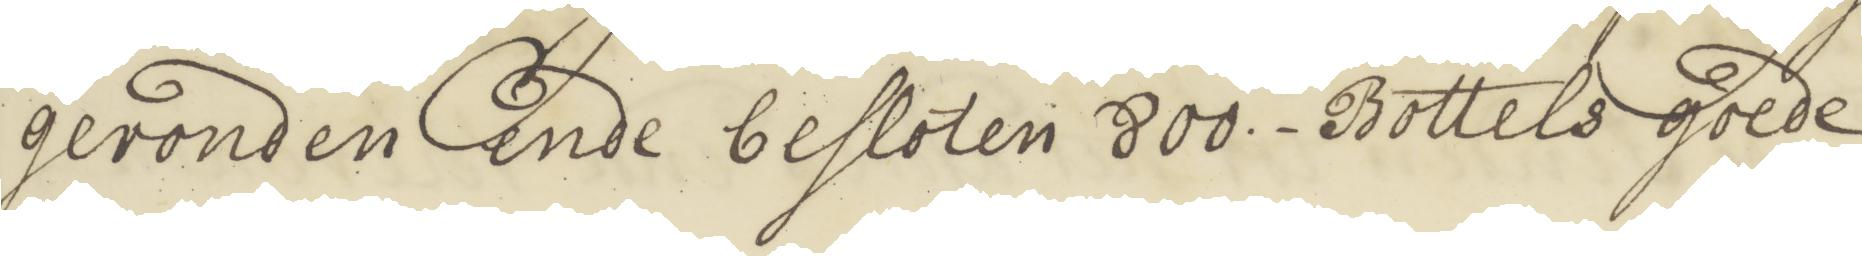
gevonden ende besloten 800. - Bottels goede
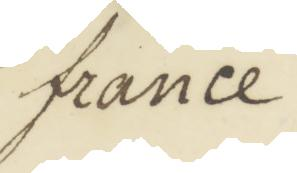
france
